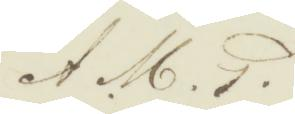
A M. T.
